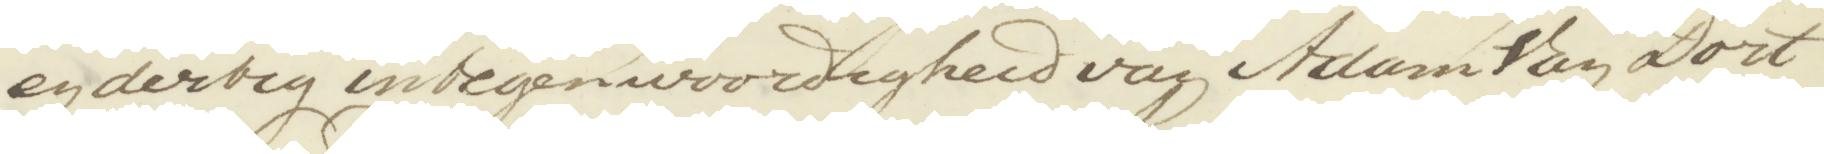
en dertig in tegenwoordigheid van Adam van Dort
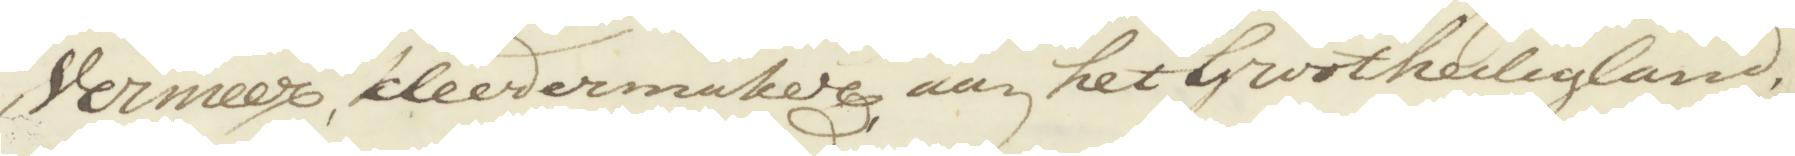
Vermeer, kleedermaker aan het Grootheiligland,
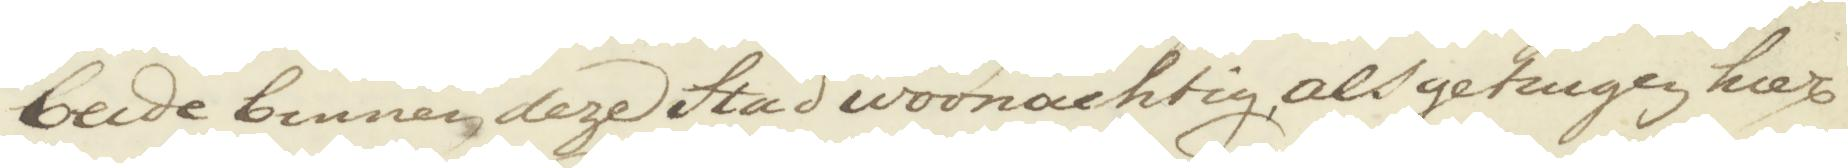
beide binnen deze Stad woonachtig, als getuigen hier
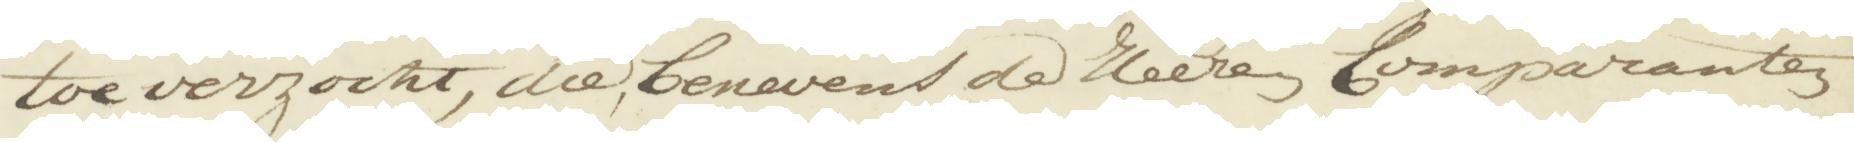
toe verzocht, die benevens de Heeren Comparanten
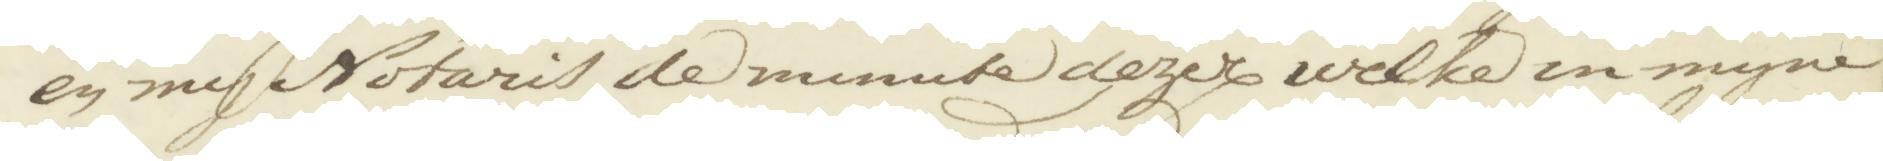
en my Notaris de minute dezer welke in myne
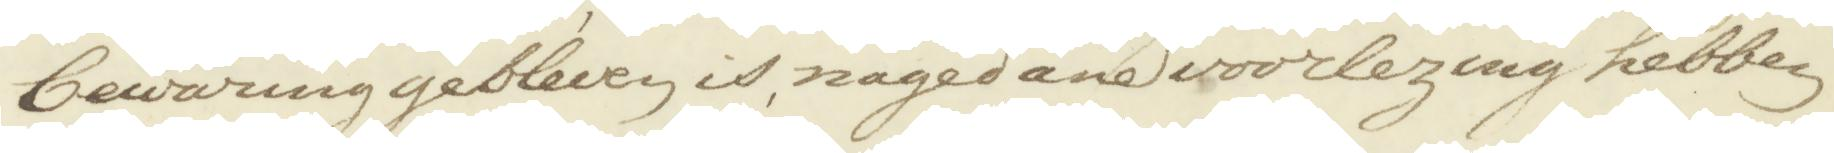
bewaring gebleven is, nagedane voorlezing hebben
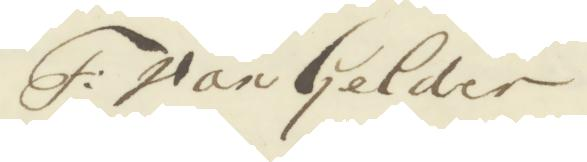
F: Van Gelder
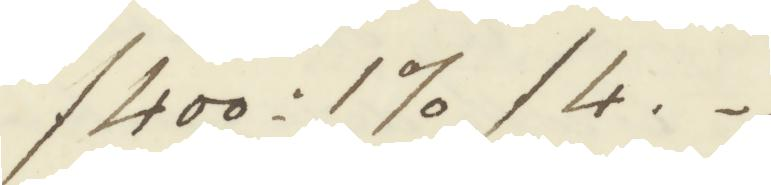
ƒ 400: 1% ƒ4. -
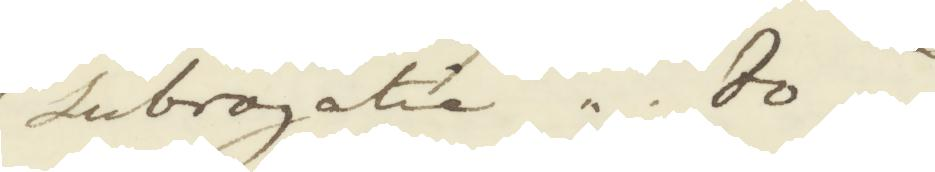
subrogatie „ . 80
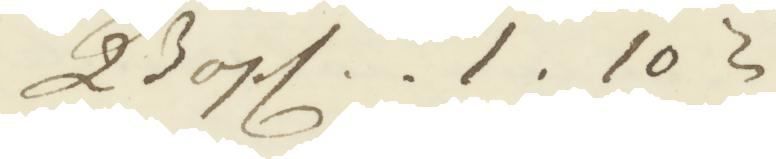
23 opC. . 1 . 10½
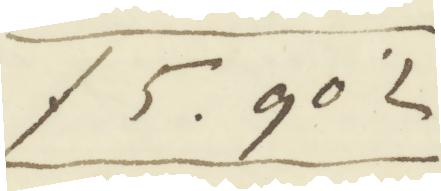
ƒ 5. 90½
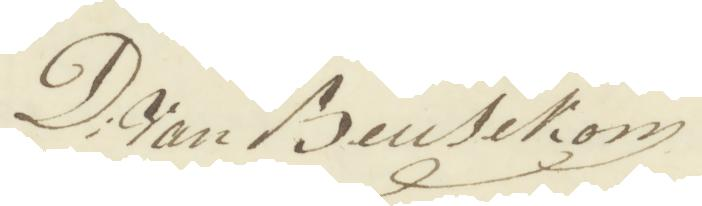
D: Van Beusekom
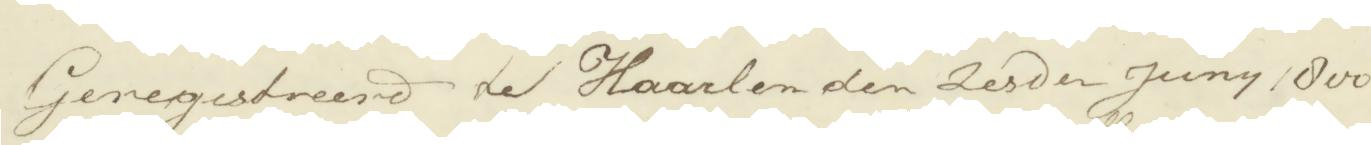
Geregistreerd te Haarlem den zesden Juny 1800
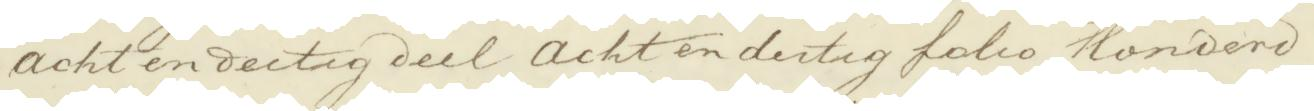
acht en dertig deel acht en dertig folio Honderd
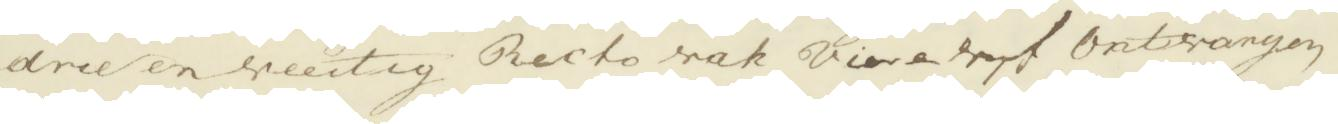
drie en veertig Recto vak vier en vyf ontvangen
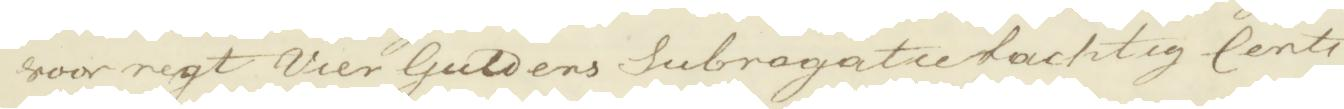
voor regt vier Guldens subrogatie tachtig Cents
